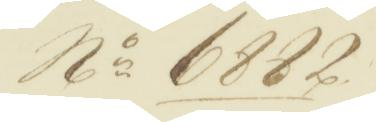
N=o 6882.
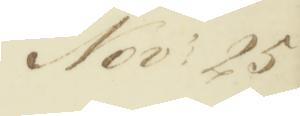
Nov: 25
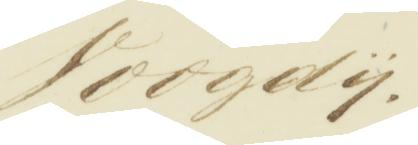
Voogdij.
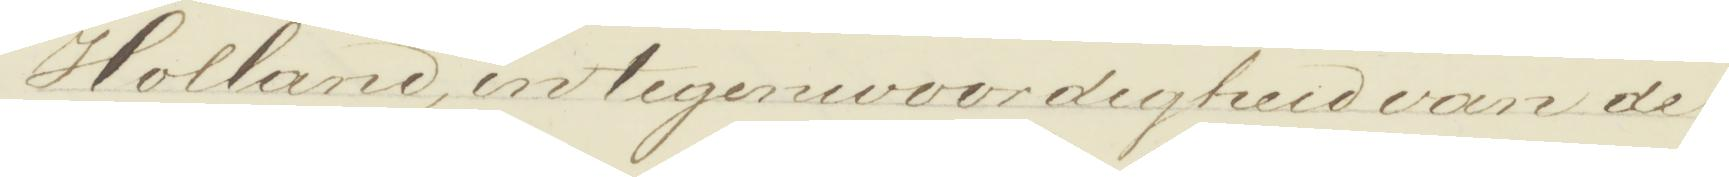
Holland, in tegenwoordigheid van de
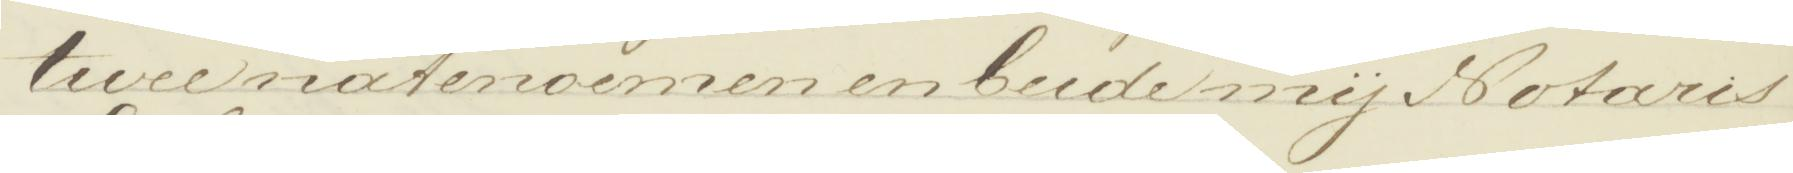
twee natenoemen en beide mij Notaris
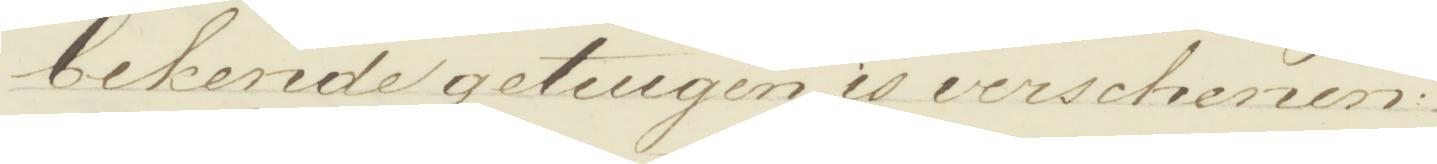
bekende getuigen is verschenen:
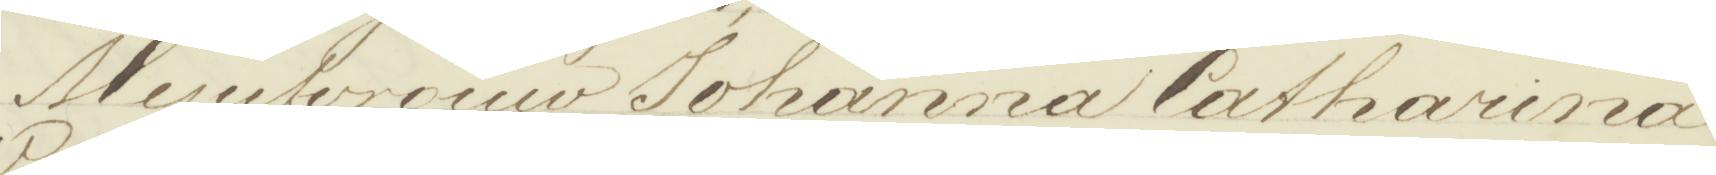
Mejufvrouw Iohanna Catharina
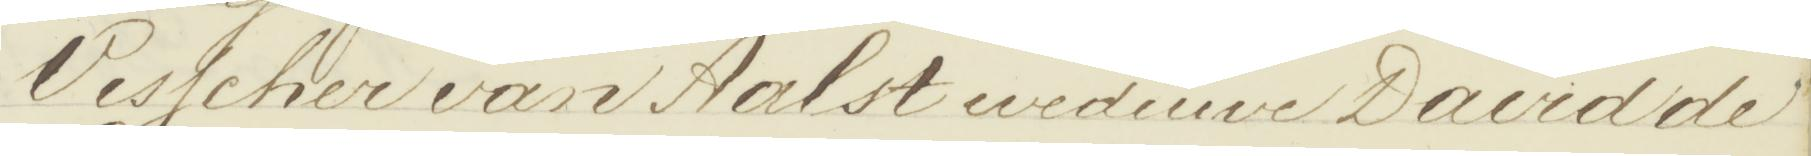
Visscher van Aalst weduwe David de
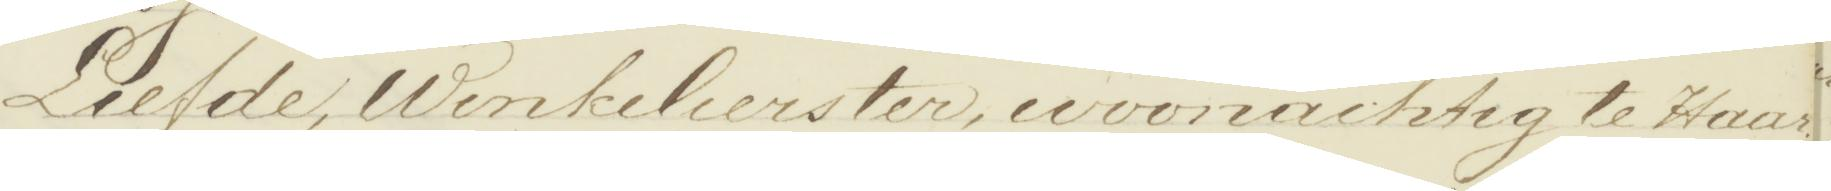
Liefde, Winkelierster, woonachtig te Haar
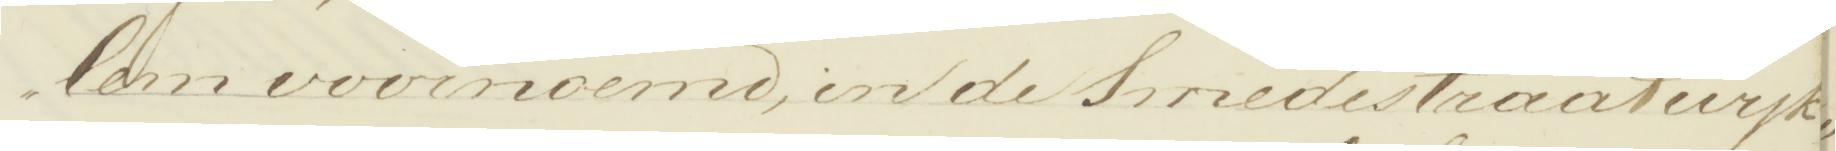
„lem voornoemd, in de Smedestraat wyk
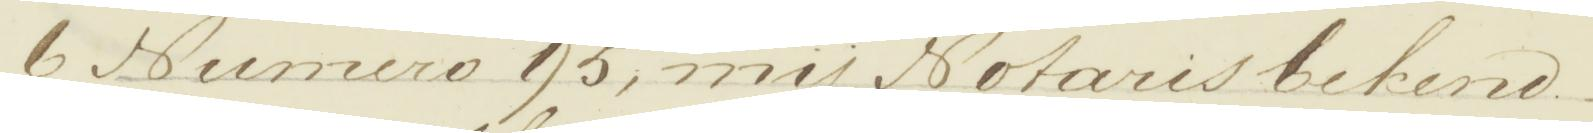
6 Numero 95; mij Notaris bekend.
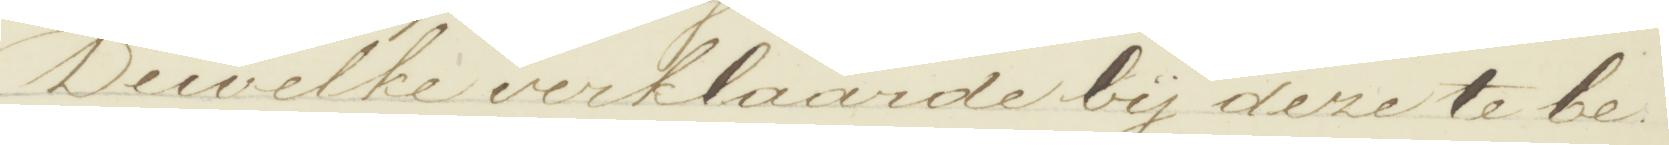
Dewelke verklaarde bij deze te be„
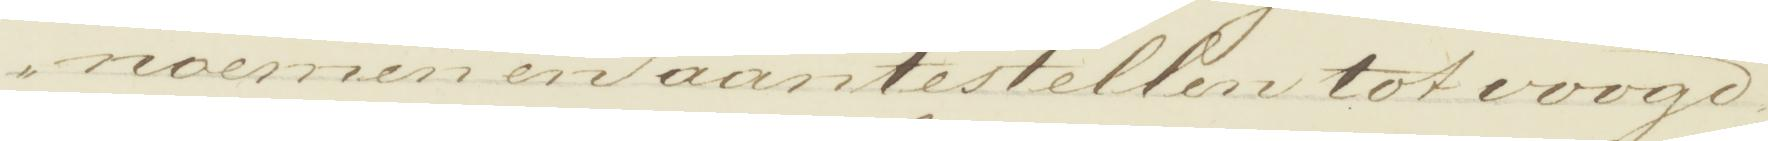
„noemen en aan testellen tot voogd
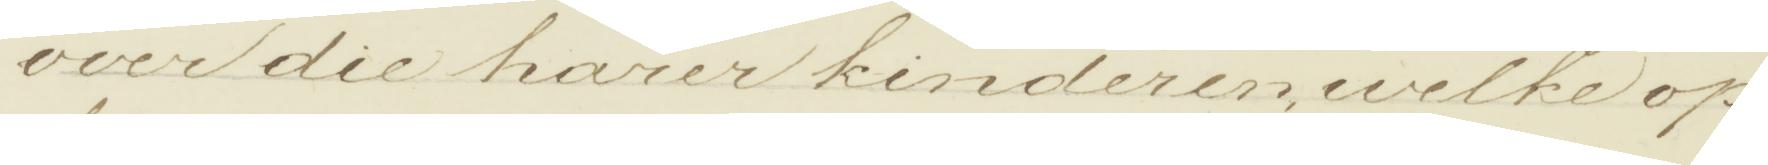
over die harer kinderen, welke op
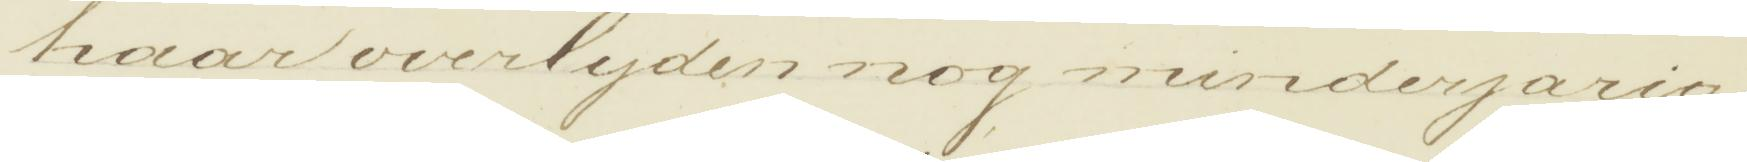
haar overlyden nog minderjarig
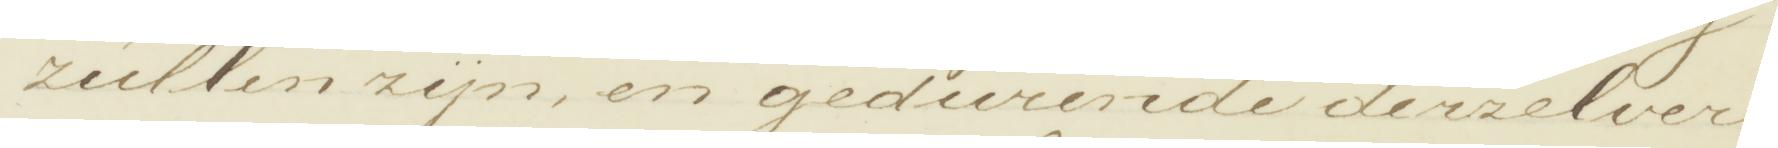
zullen zijn, en gedurende derzelver
